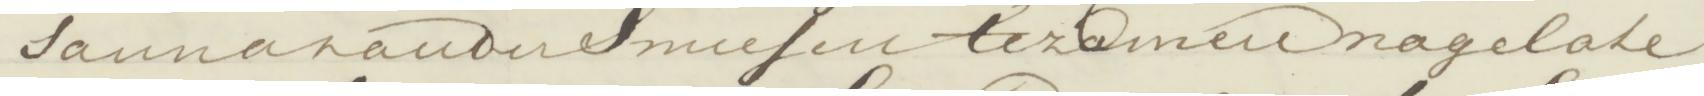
sanna van der Smissen tezamen nagelate
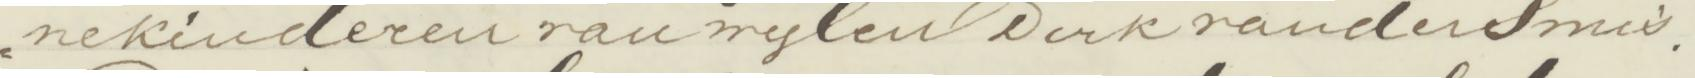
„ =ne kinderen van wylen Dirk van der Smis,
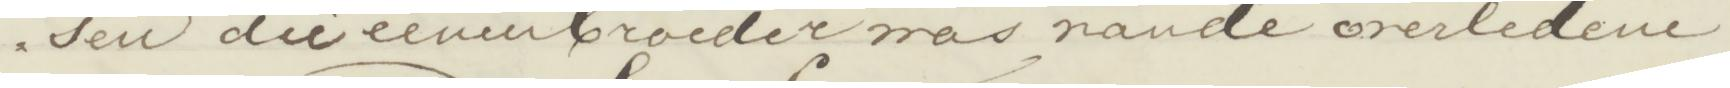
„ =sen die eenen broeder was van de overledene
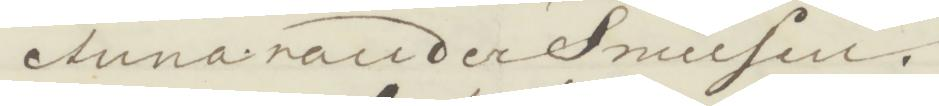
Anna van der Smissen.
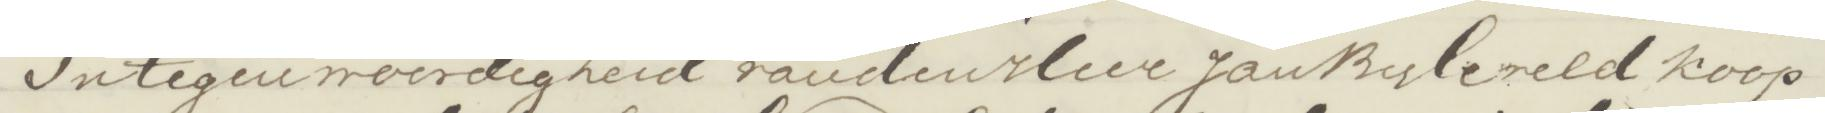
Integenwoordigheid van den Heer Jan Byleveld koop
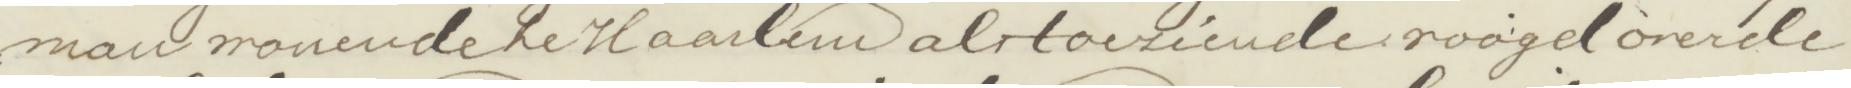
=man wonende te Haarlem als toeziende voogd over de
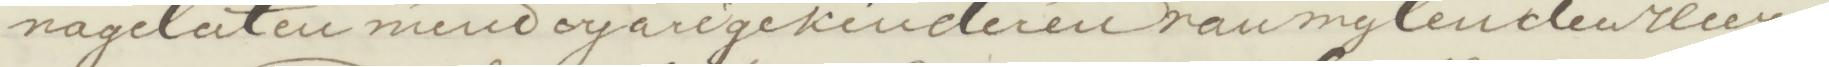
nagelaten minderjarige kinderen van wylen den Heer
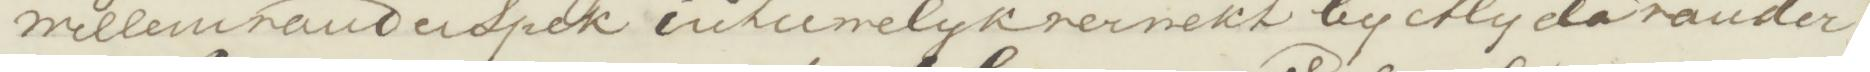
willem van der Spek in huwelyk verwekt by Alyda van der
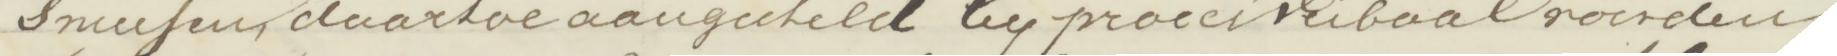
Smissen, daartoe aangesteld by proces Verbaal voor den
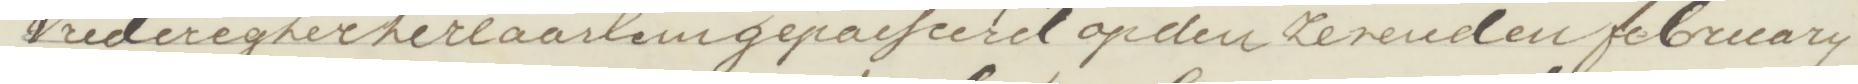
Vrederegter te Haarlem gepasseerd op den zevenden february
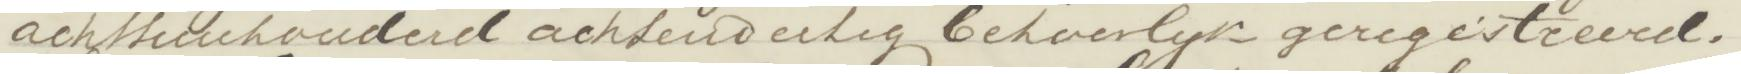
achttienhonderd achtendertig behoorlyk geregistreerd.
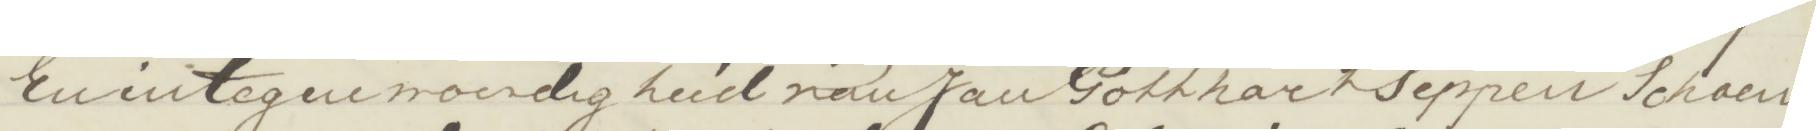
En integenwoordigheid van Jan Gotthart Seppen Schoen
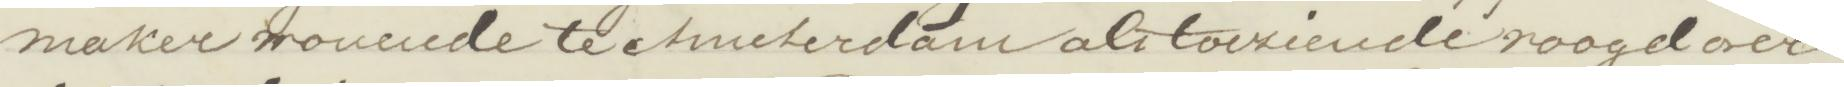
=maker wonende te Amsterdam als toeziende voogd over
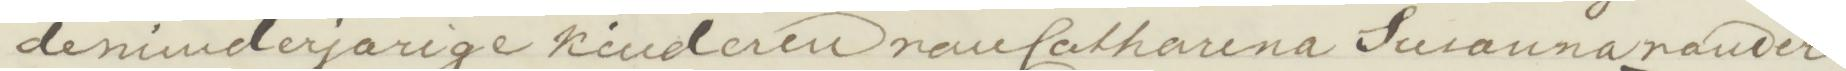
de minderjarige kinderen van Catharina Susanna van der
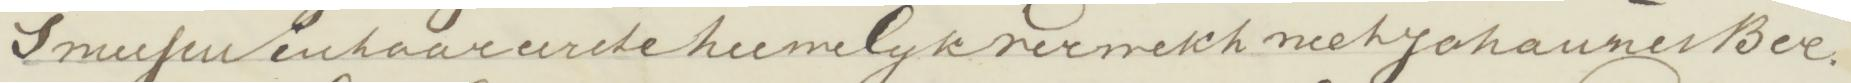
Smissen in haar eerste huwelyk verwekt met Johannes Ber.
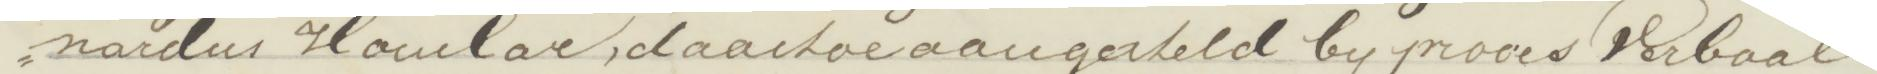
=nardus Honslar, daartoe aangesteld by proces Verbaal
